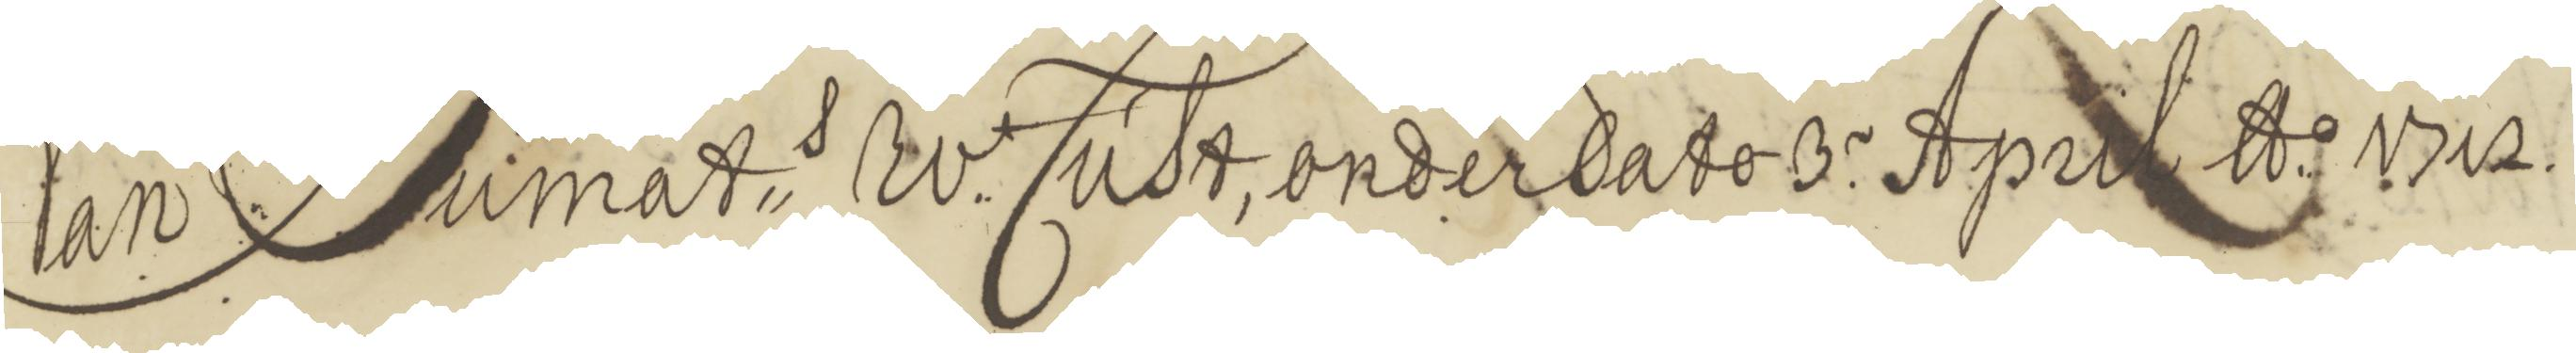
Van Sumat„s w„t Cust, onder dato 3.e April A„o 1712.
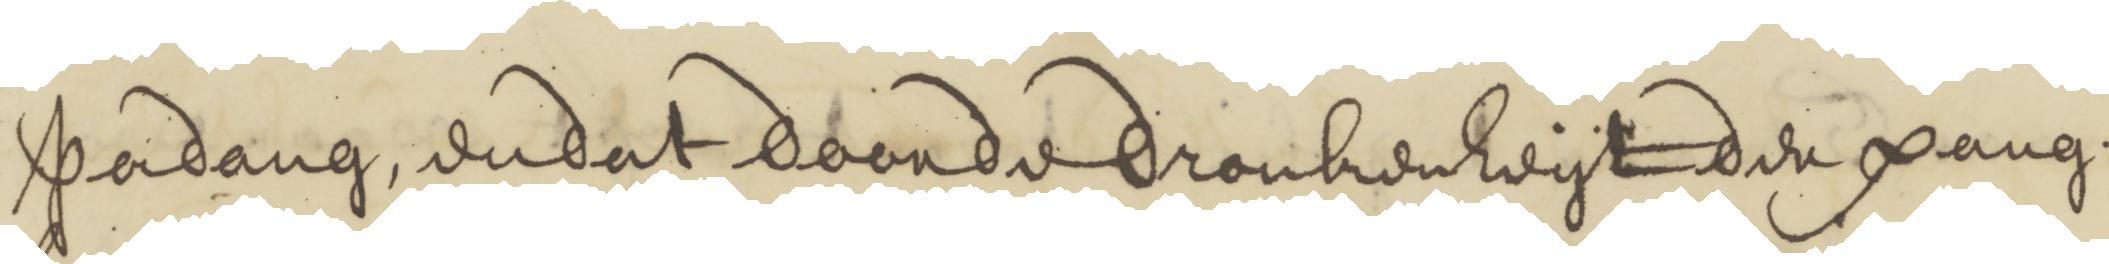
padang, en dat door de dronkenheijt der pang„
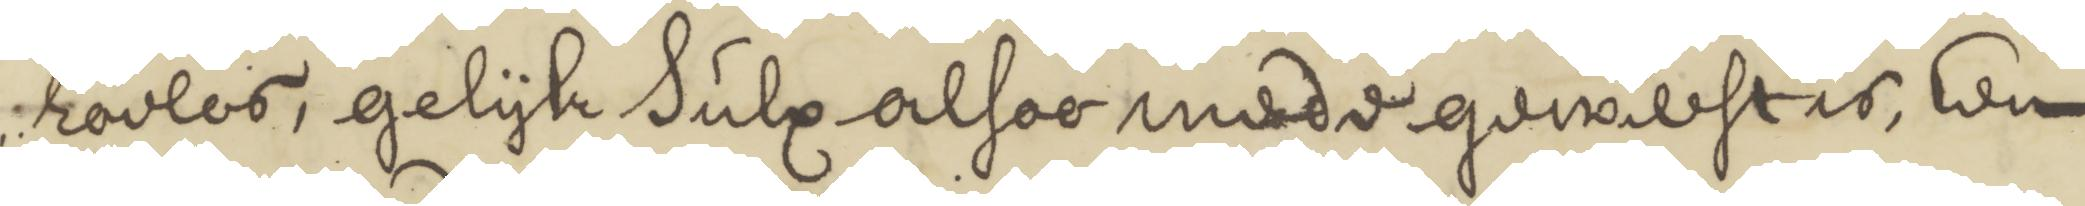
hoelos, gelijk Sulx alsoo mede geweest is, ten
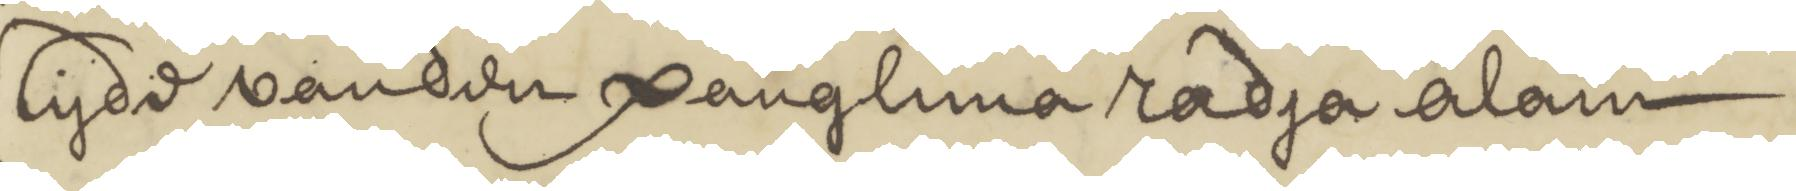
tijde van den panglima radja alam.
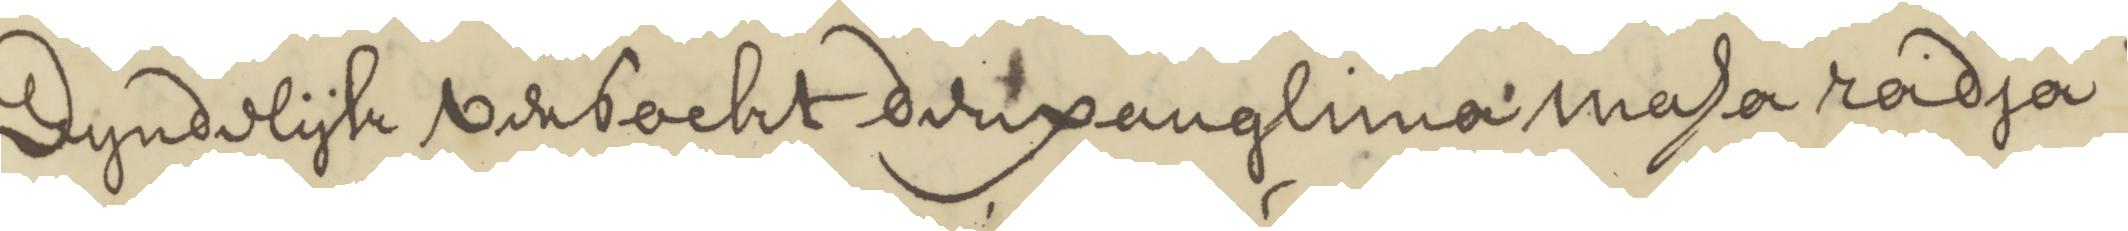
Eyndelijk versoekt denpanglima maha radja —
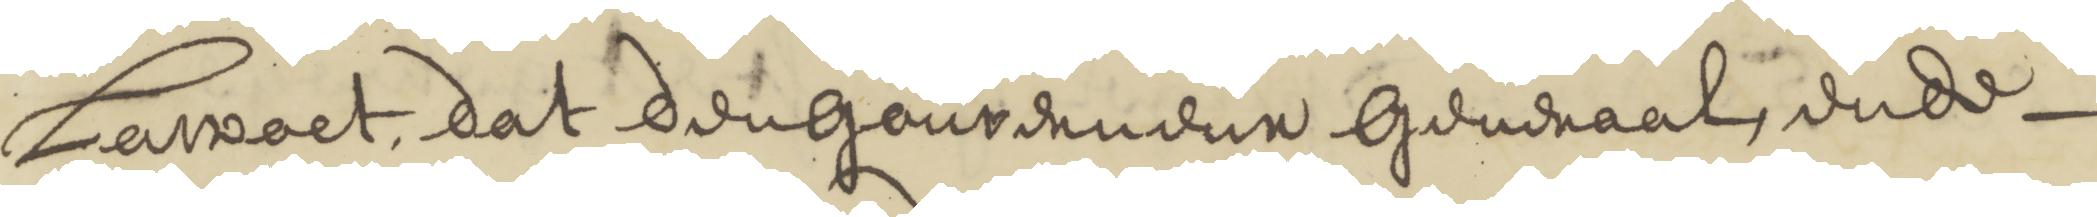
Lawoet, dat dengouverneur generaal, ende —
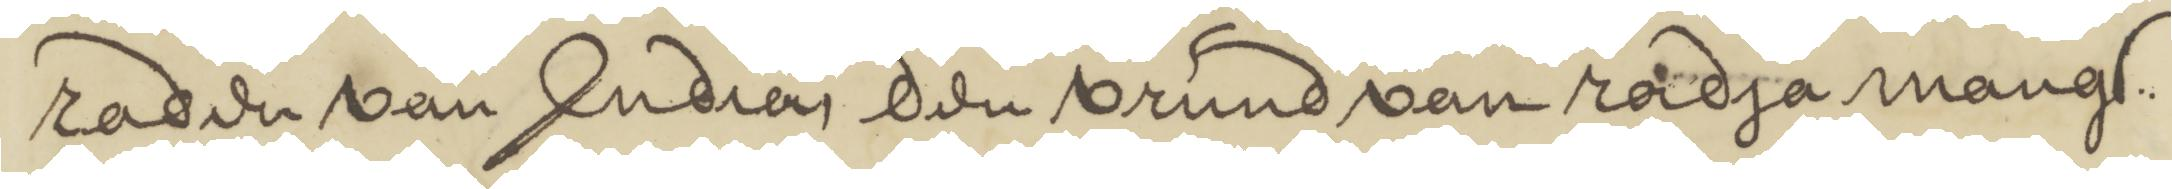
raden van India, den vrund van radja mangt„
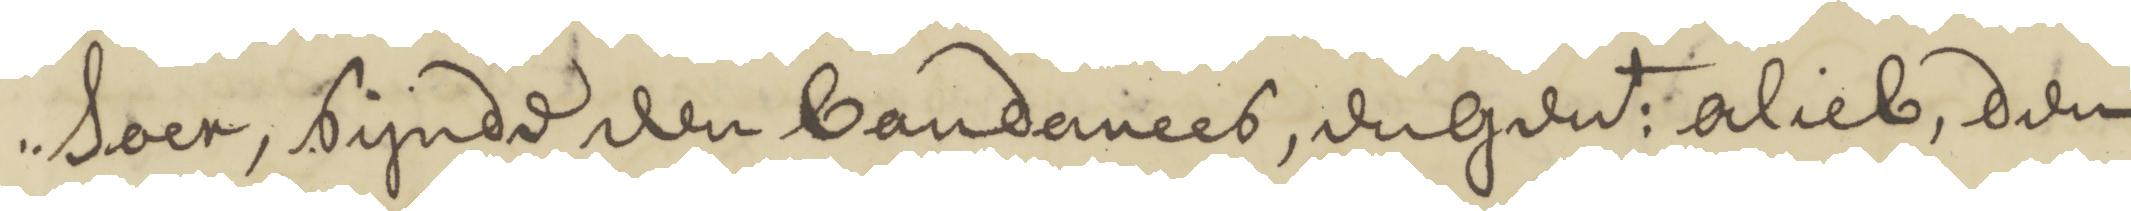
„Soer, sijnde een bandanees , engen:t alieb, den
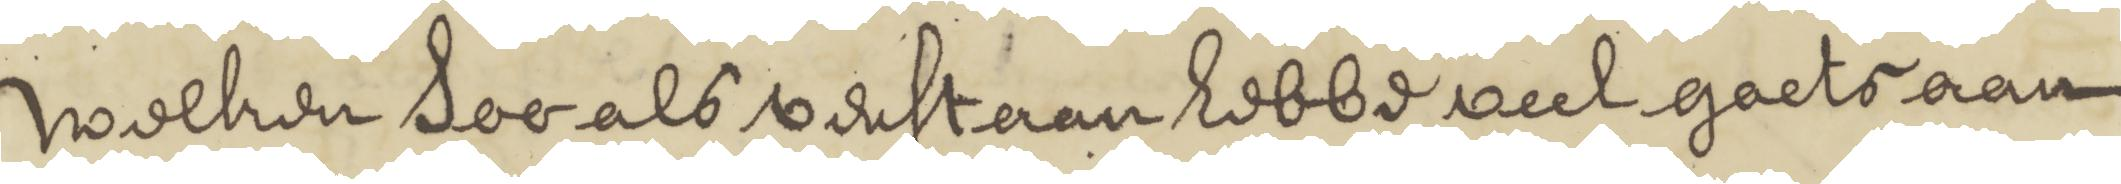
welken soo als verstaan hebbe veel goets aan
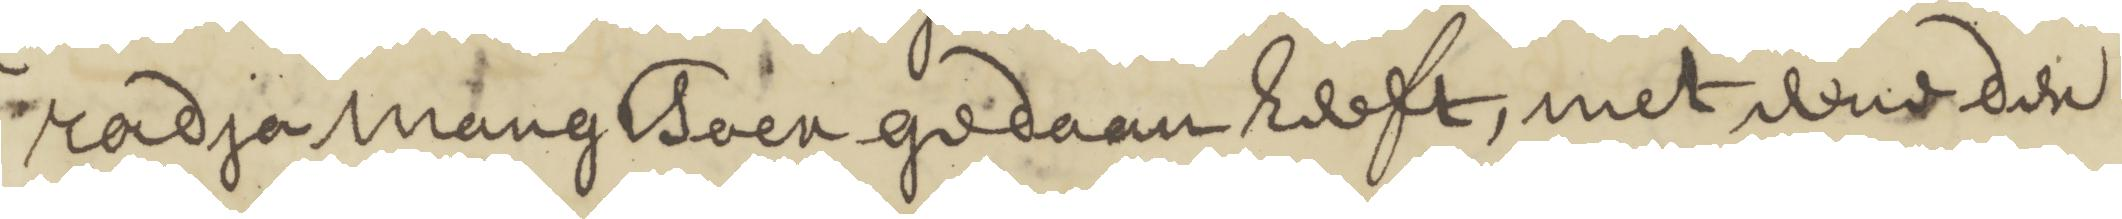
radja mang tsoer gedaan heeft, met eene der
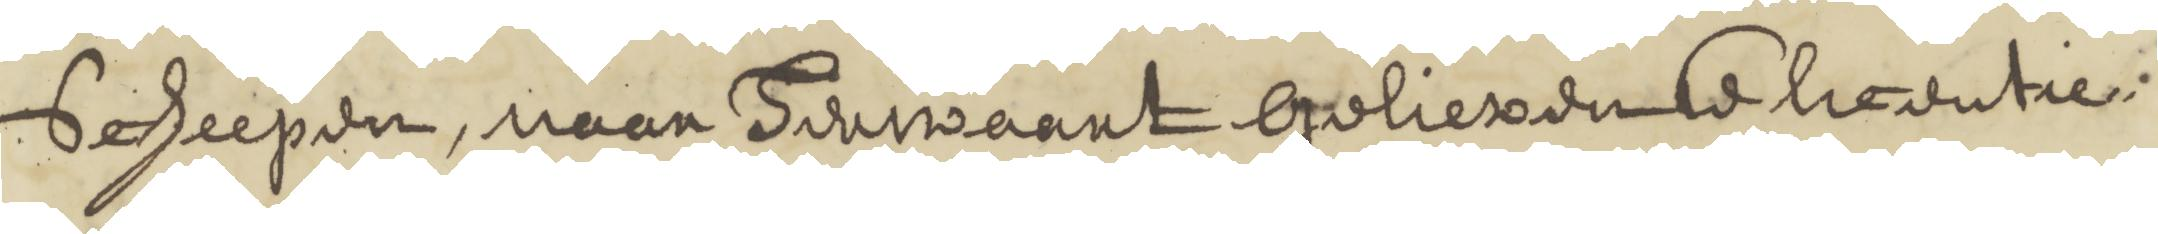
scheepen, naar Herwaart gelieven te licentie„
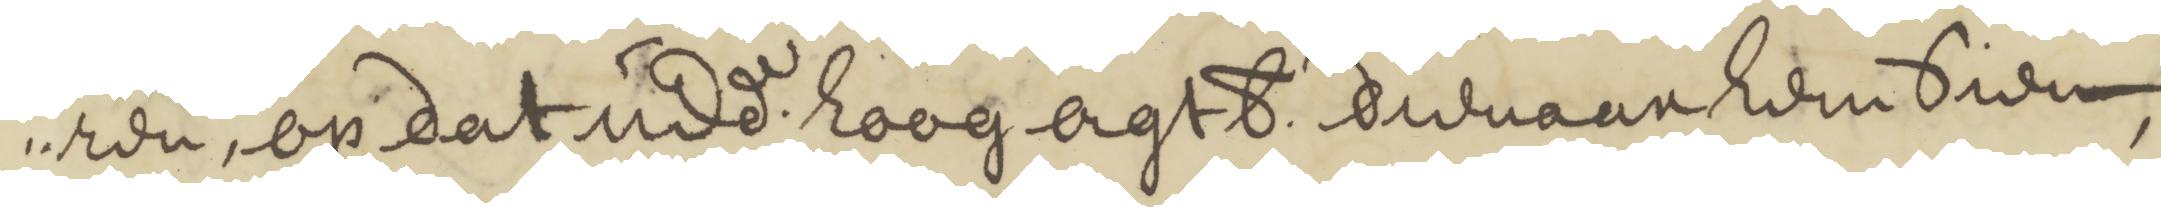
„ren ,op dat uEd.e hoog agtb. dienaar hen sien,
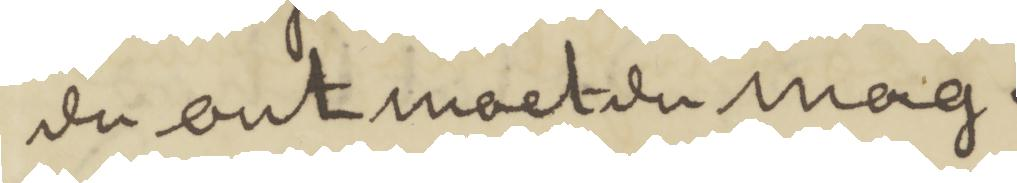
en ontmoeten mag.
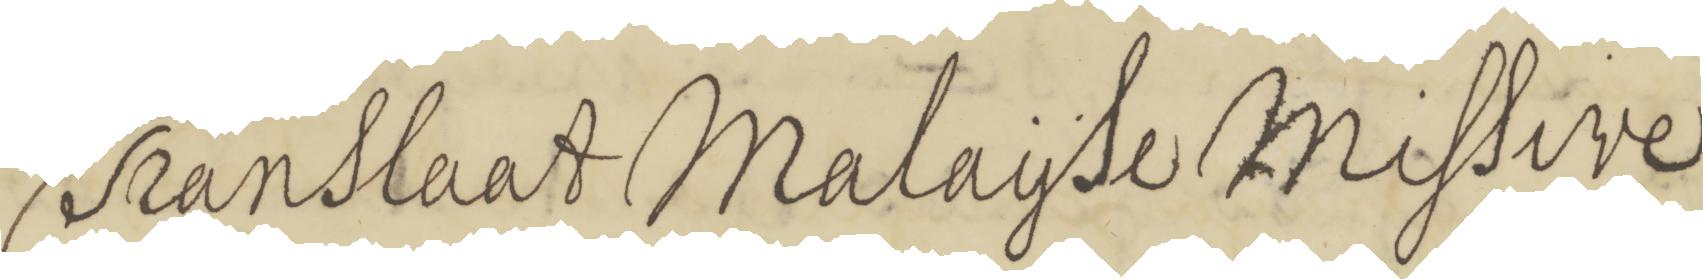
Translaat Malaijse Missive
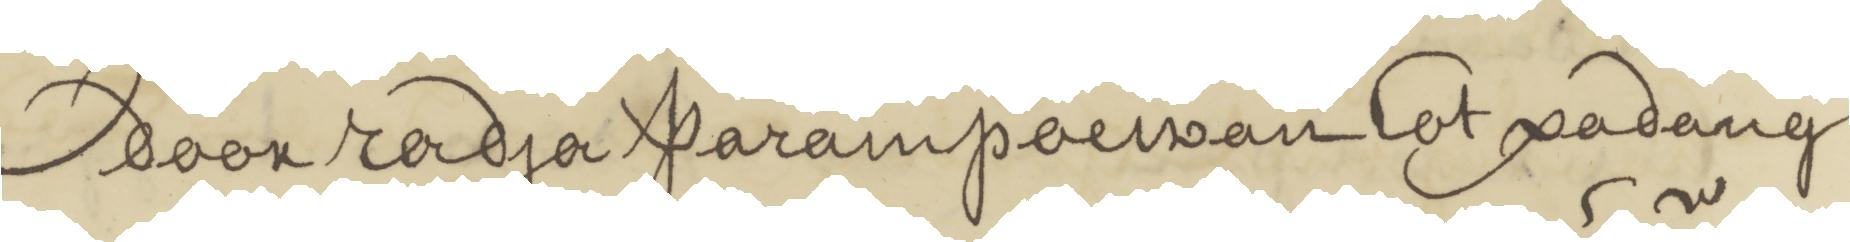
door radja Parampoewan tot padang
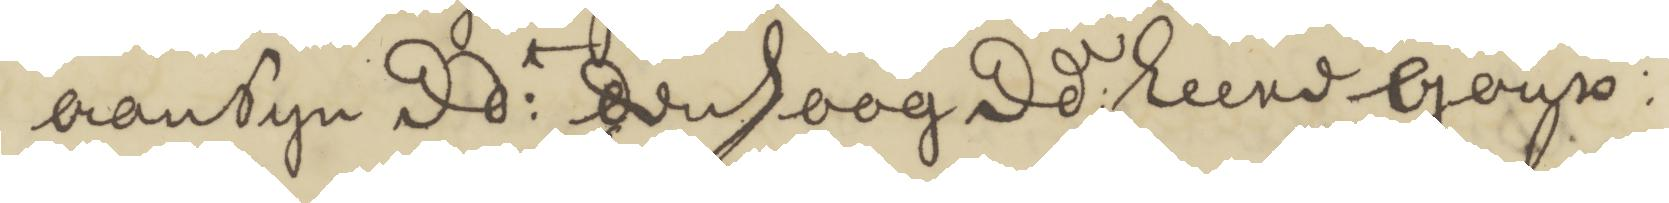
aansijn Ed:t den hoog Ed:e heere gouv:r
